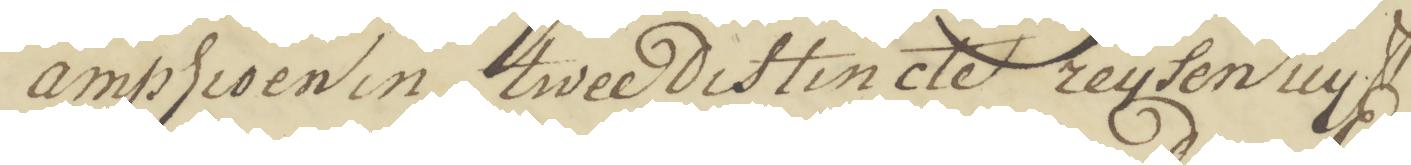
amphioen in twee distincte reijsen uyt
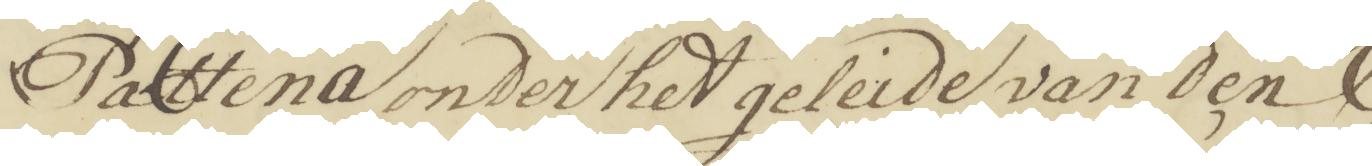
Pattena onder het geleide van den E
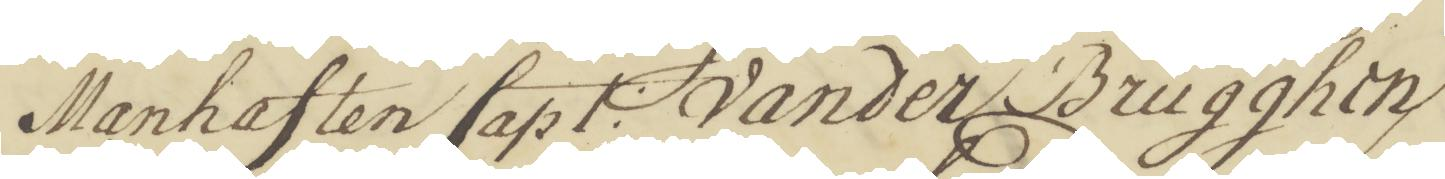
Manhaften Capt: vander Brugghen
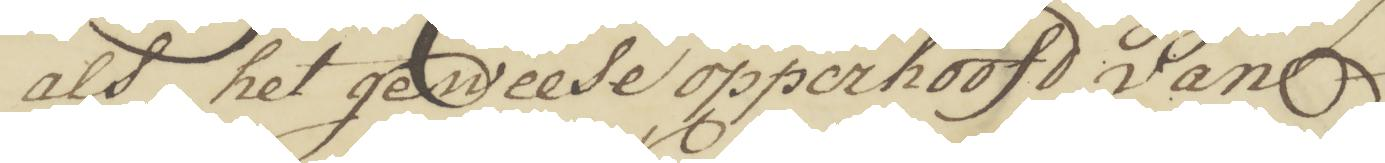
als het geweese opperhoofd van
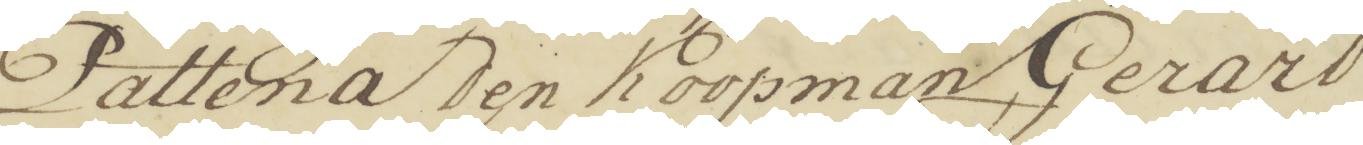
Pattena den Koopman Gerard
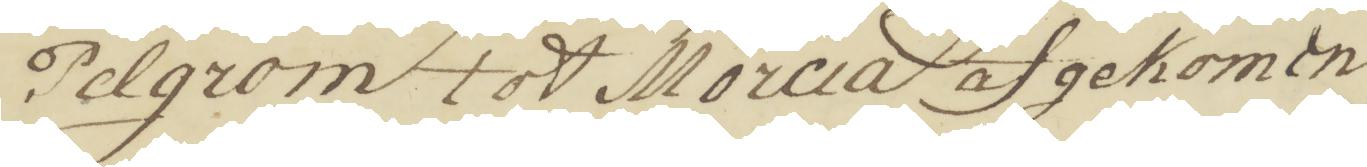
Pelgrom tot Morcia afgekomen
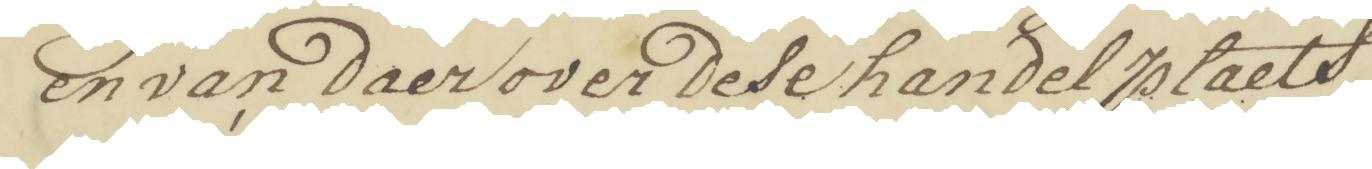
en van daer over dese handelplaets
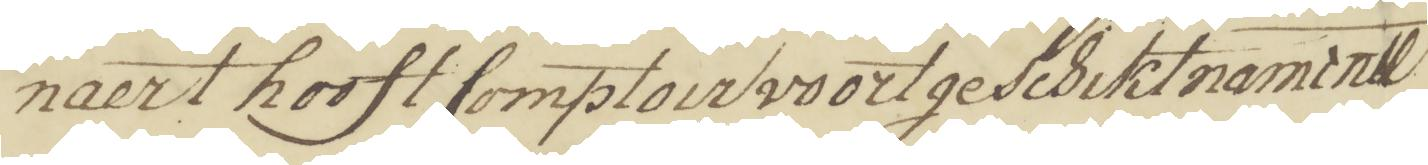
naer 't hooft Comptoir voortgeschikt namentlijk
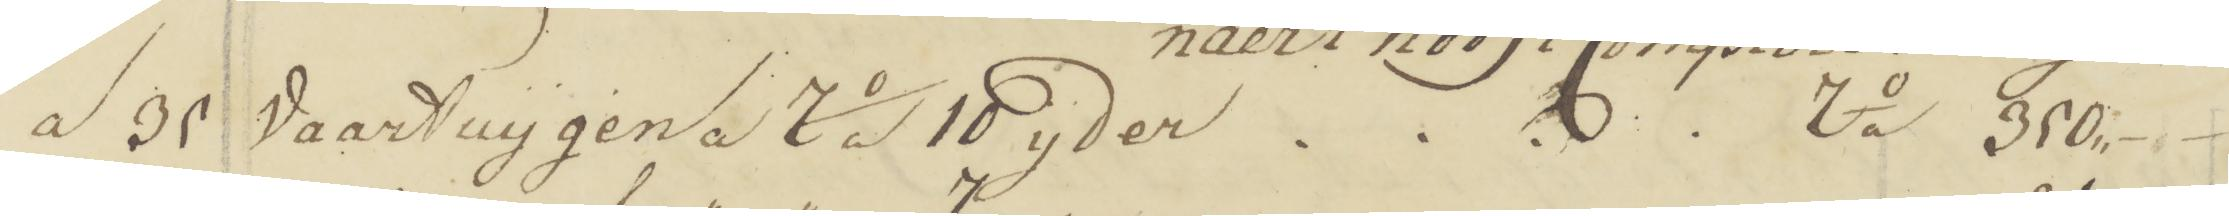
a 35 vaartuijgen a r o/a 10 ijder . . . . R o/a 350:-:-
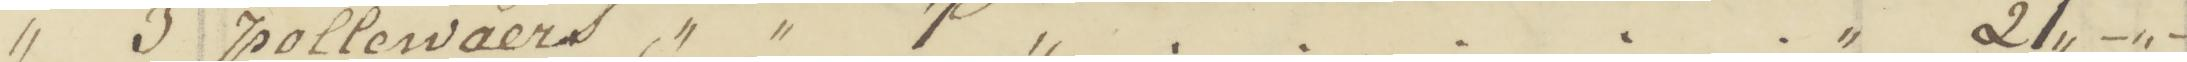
„ 3 pollewaers „ „ „ 7 „ . . . . „ 21„ - „
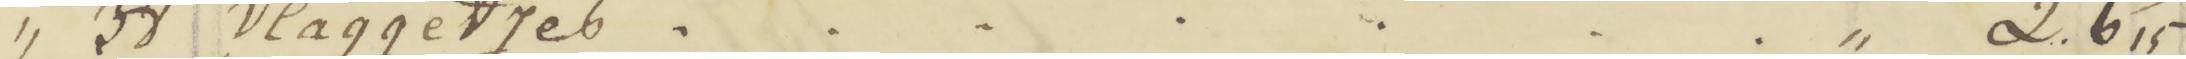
„ 38 vlaggetjes . . . . . . . . „ 2. 6 1/15
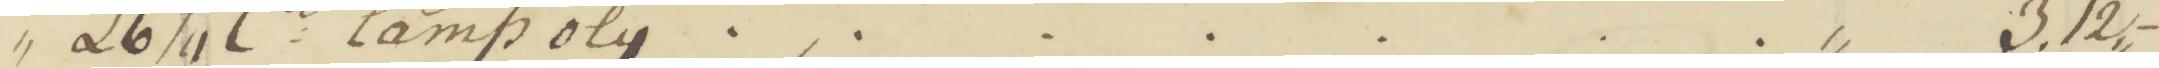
„ 26¼ l:r lampolij . . . . . . „ 3.12„
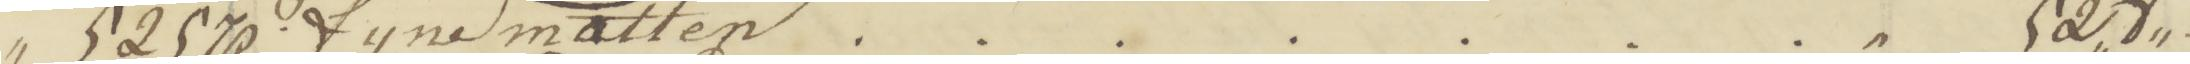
525 p-s: fijne matten. . . . . . . „ 52„ 8„
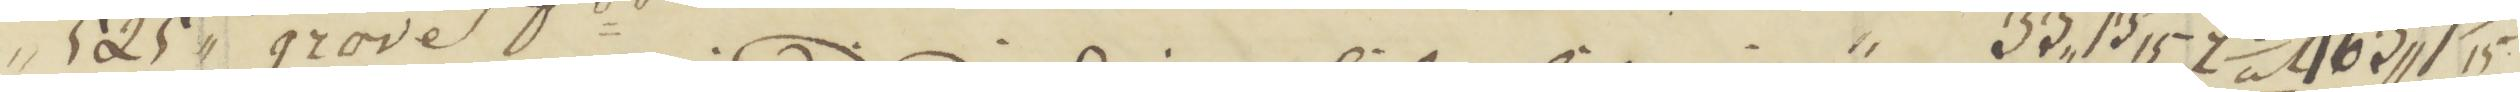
525„ grove d=os . . . . . . . „ 33: 13 1/15„ r:o/s 463 „7 2/15
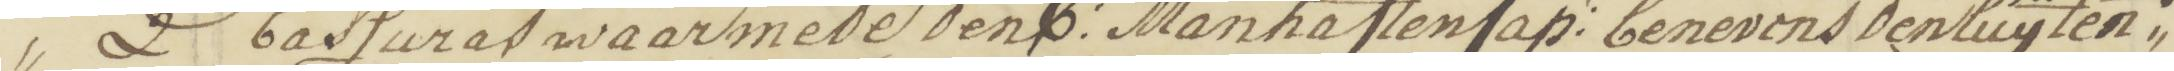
„ 2 bassuras waarmede den E: Manhaften Cap:t benevens derluijten„
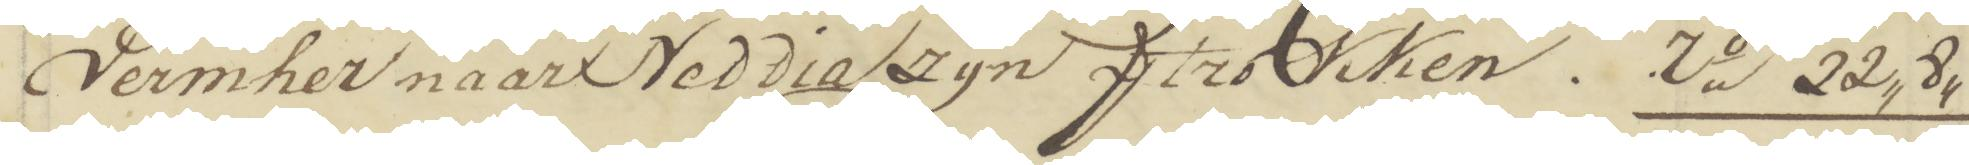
vermher naar Neddia zijn vertrokken. .R o/a 22„8„
